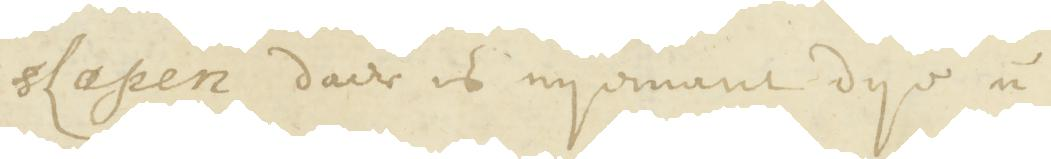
slapen daer is nyemant dye u
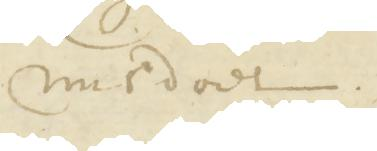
misdoet.
